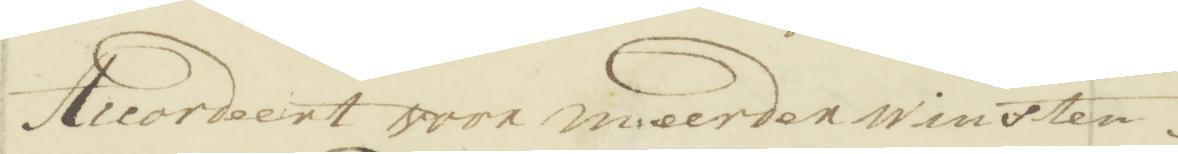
Accordeert voor meerder winsten
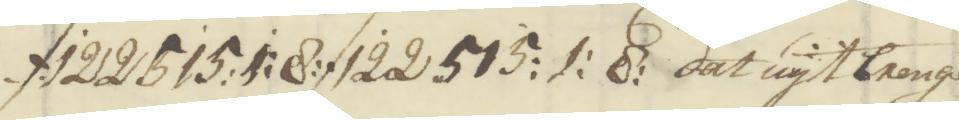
ƒ.122515:1:8:ƒ122515: 1: 8: dat uijtbreng
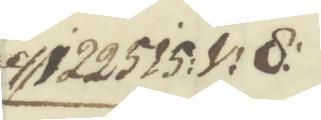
„122515:1:8:
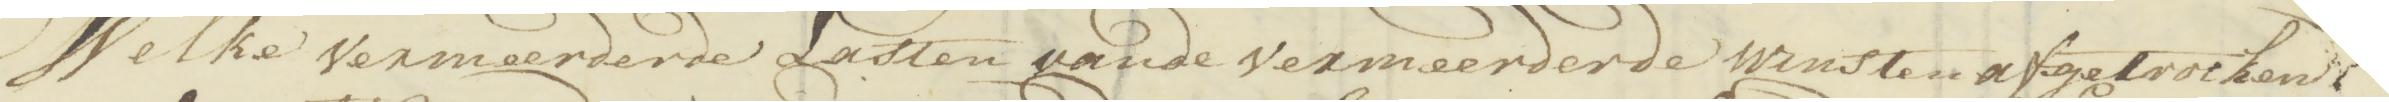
Welke vermeerderde Lasten vande vermeerderde winsten afgetrocken
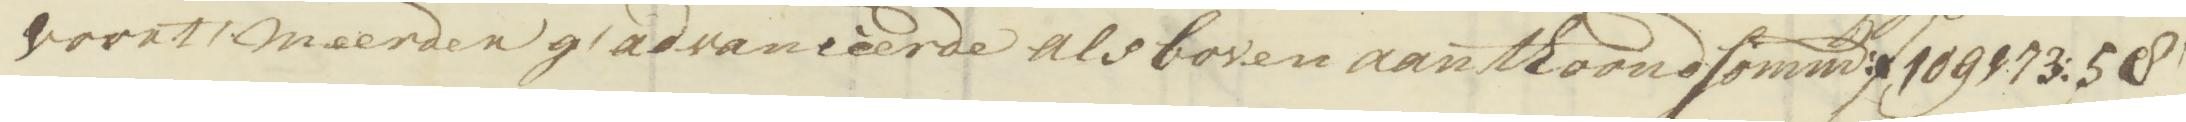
voort' meerder g’advanceerde als boven aanthoond somm: ƒ1091.73:58
